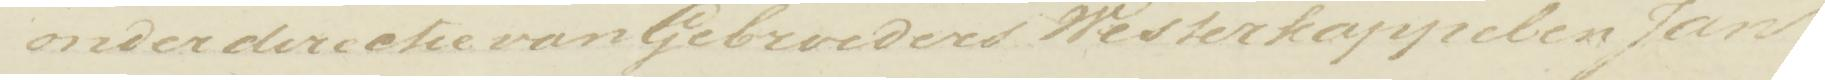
onder directie van Gebroeders Westerkappelen Jan
